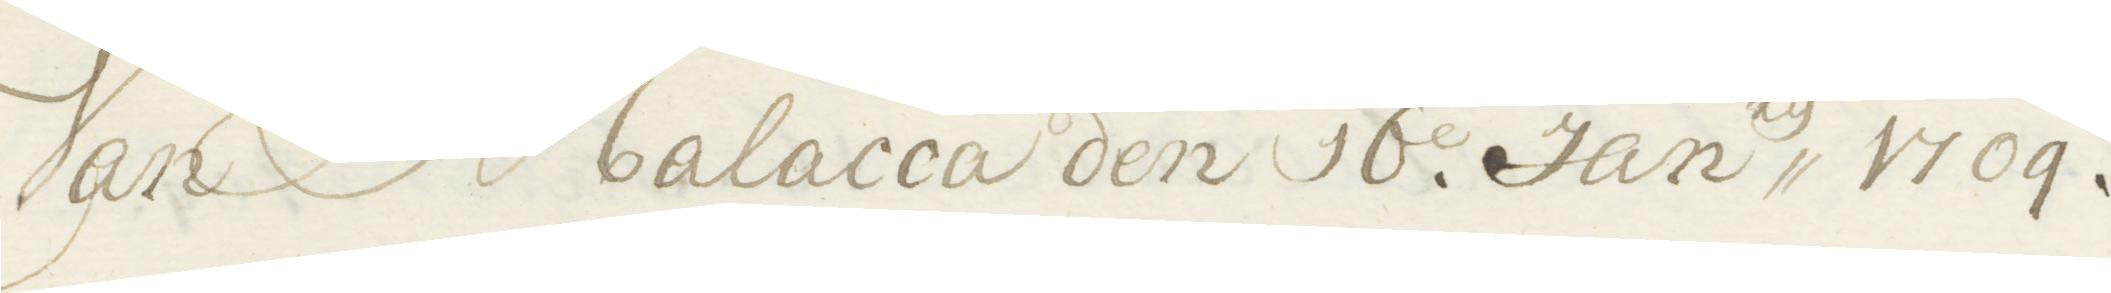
Van Malacca den 16.e Ian„rij 1709.
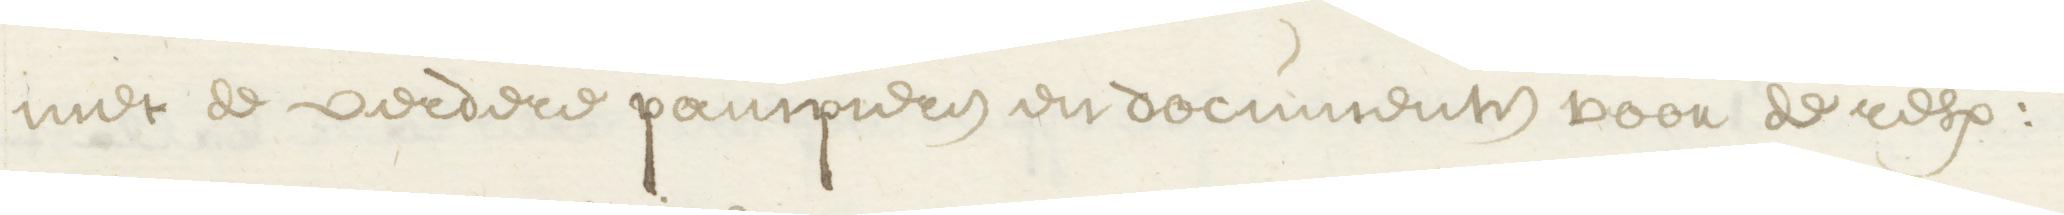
met de verdere pampieren en documenten voor de resp:
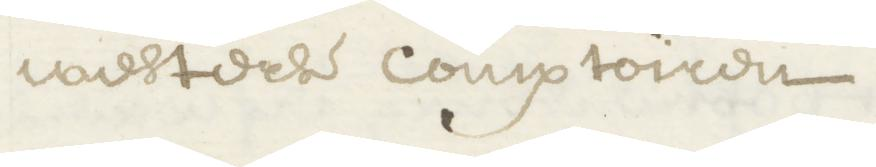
westerse comptoiren.
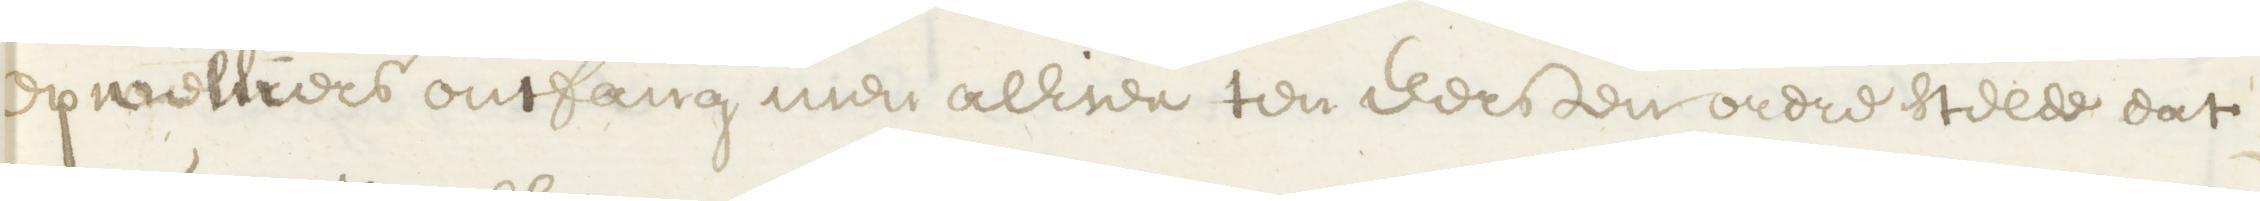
Op welkers ontfang men alhier ten Eersten ordre stelde dat
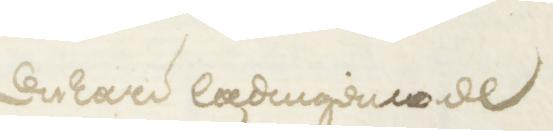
En hare ladingen wel
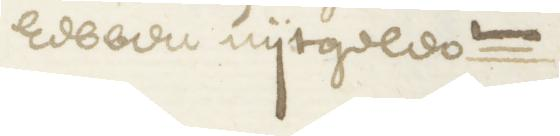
hebben uijtgelev=t
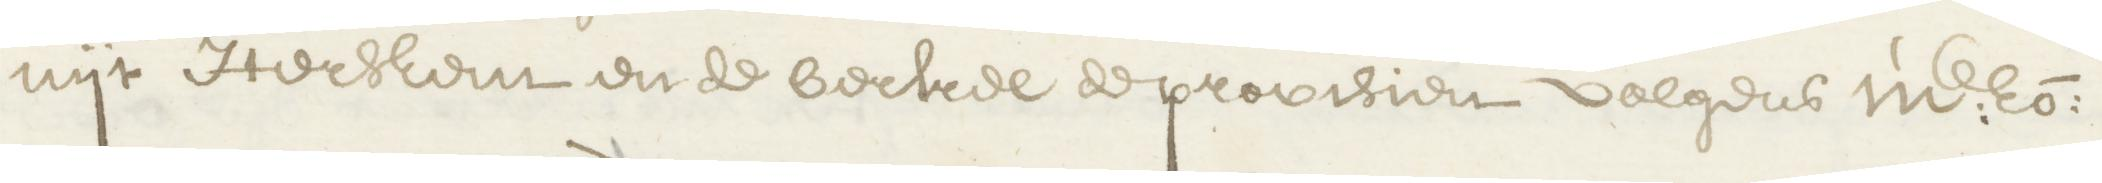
uijt Itershem en de berkel de provisien volgens uE: ho:
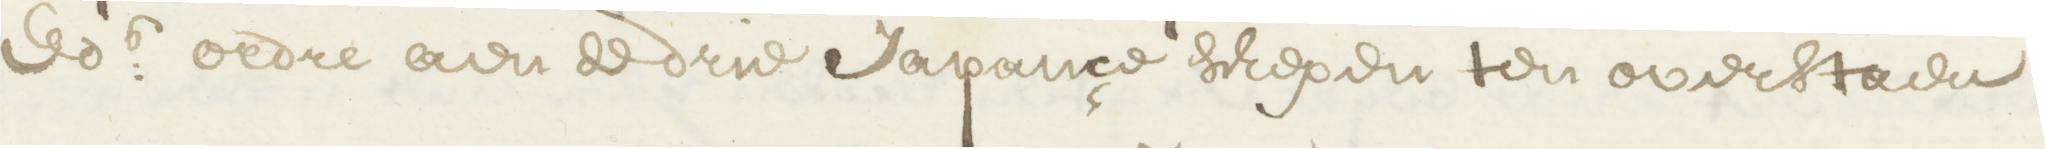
Ed:s ordre aen de drie Iapançe schepen ten overstaen
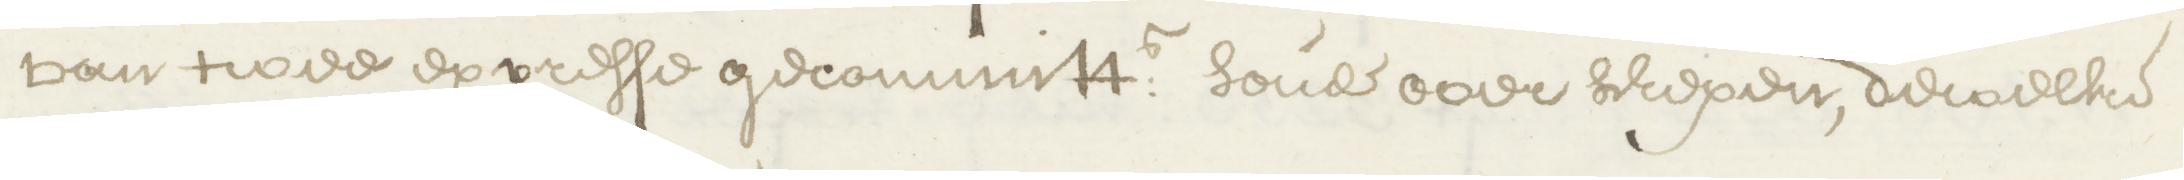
van twee expresse gecommitt:s soude over schepen, dewelke
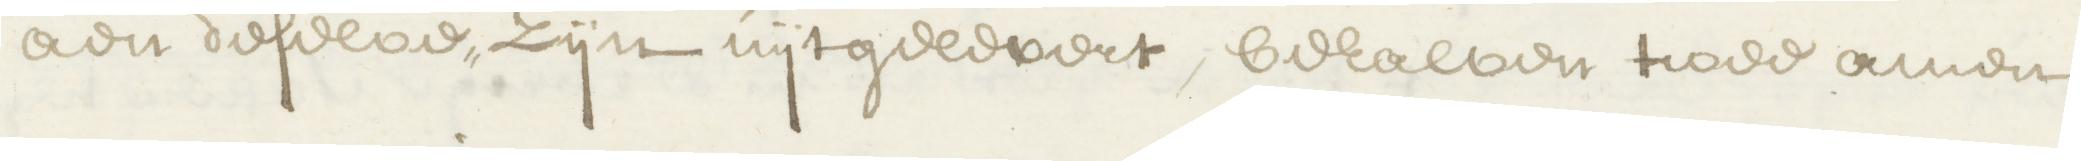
aen deselve „ zijn uijtgelevert, behalven twee amen
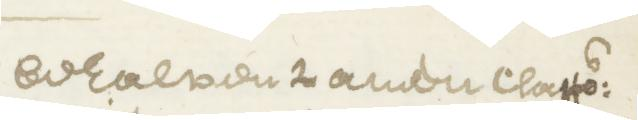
behalven 2 amen clapp:s
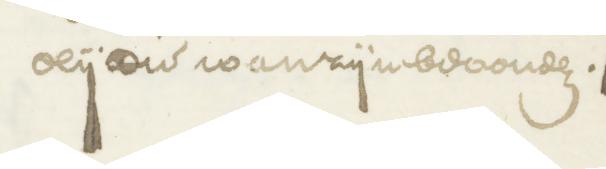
olij die wan zijn bevonden.
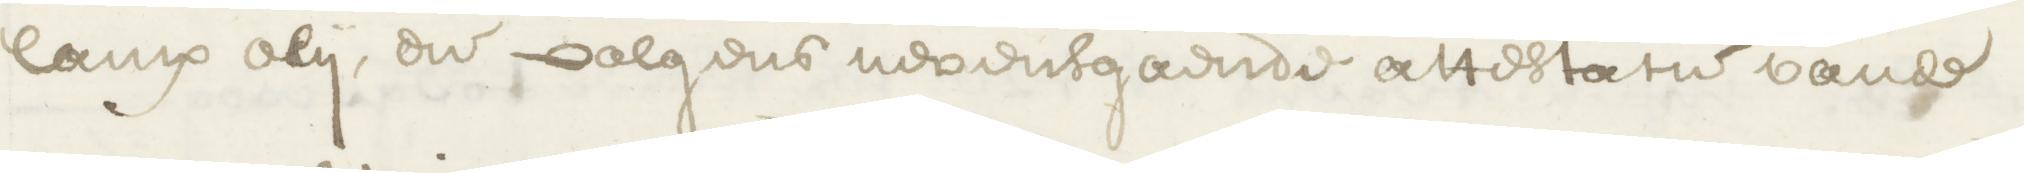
lamp olij, die volgens nevensgaende attestatie vande
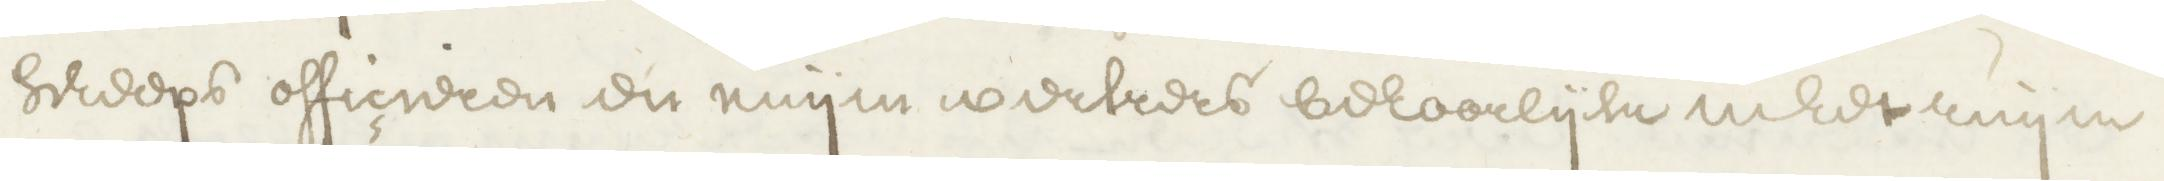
scheeps offiçieren en ruijm werkers behoorlijk in het ruijm
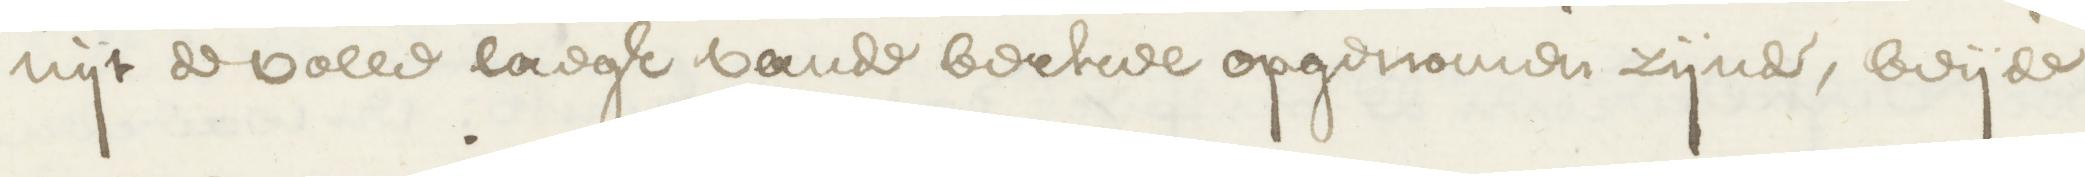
uijt de volle laegh vande berkel opgenomen zijnde, beijde
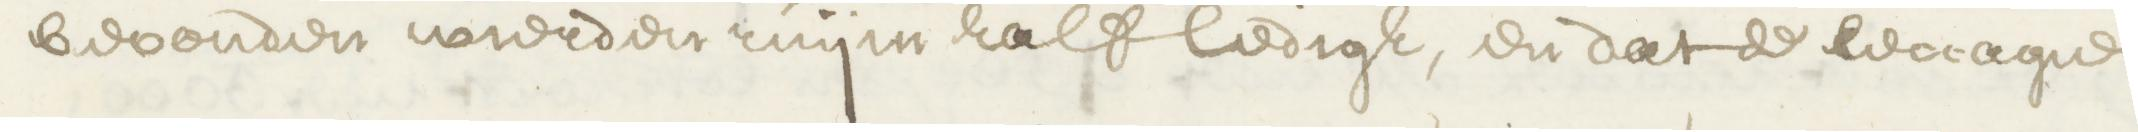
bevonden wierden ruijm half ledigh, en dat de leccagie
